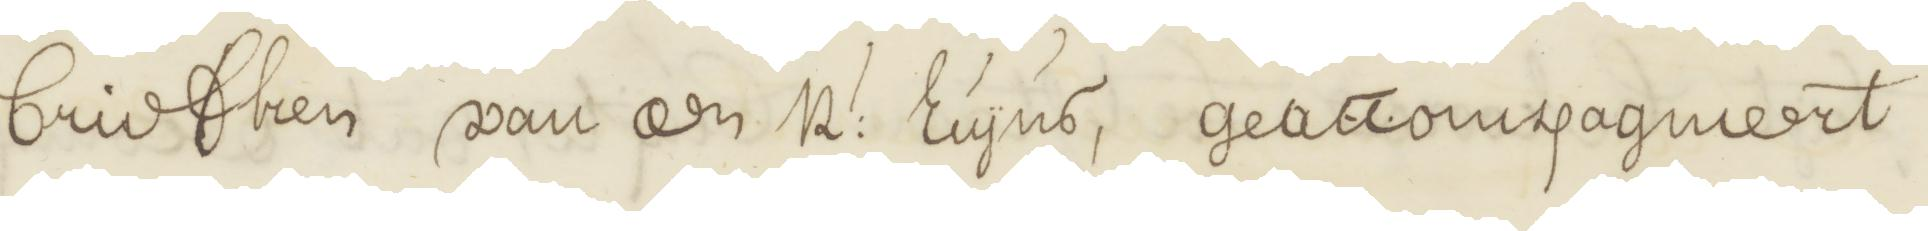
briefken van den 12:' hujus, geaccompagneert
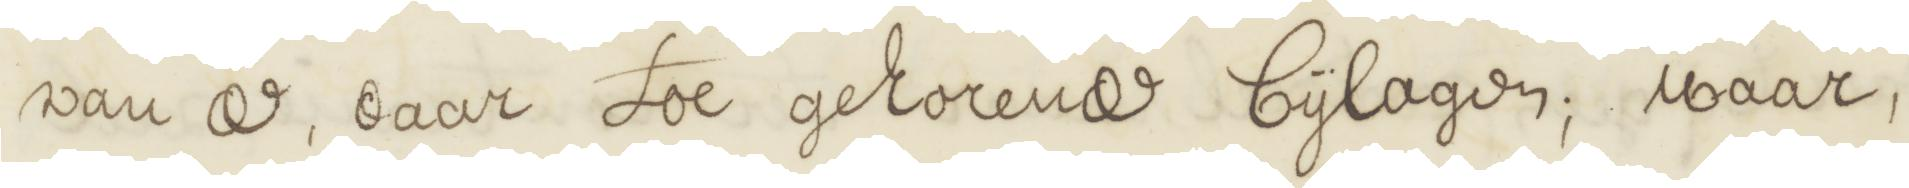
van de, daar toe gehorende bijlagen; waar,
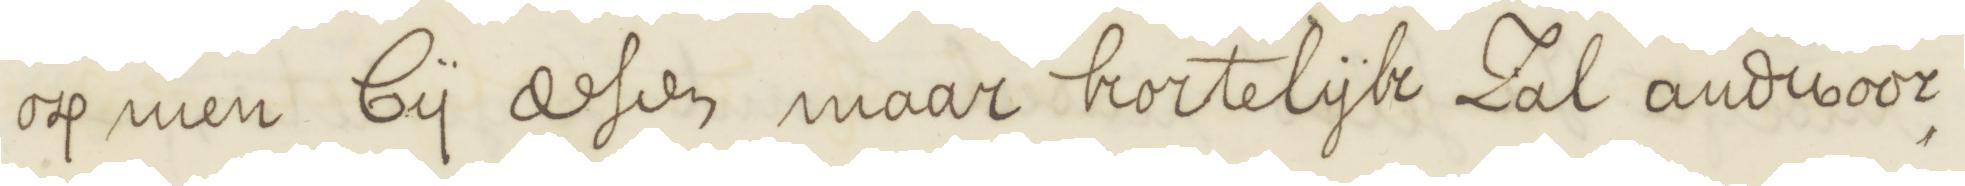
op men bij desen maar kortelijk Zal andwoor„
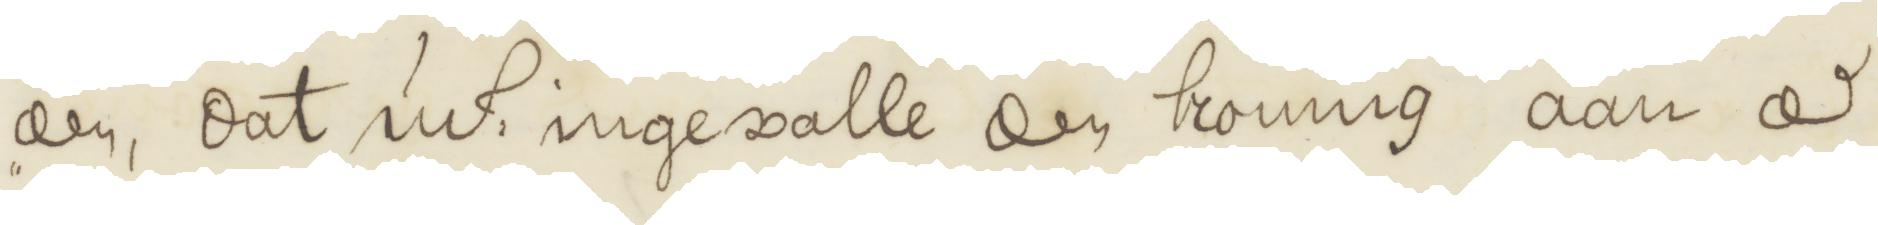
„den, dat uE: ingevalle den koning aan de
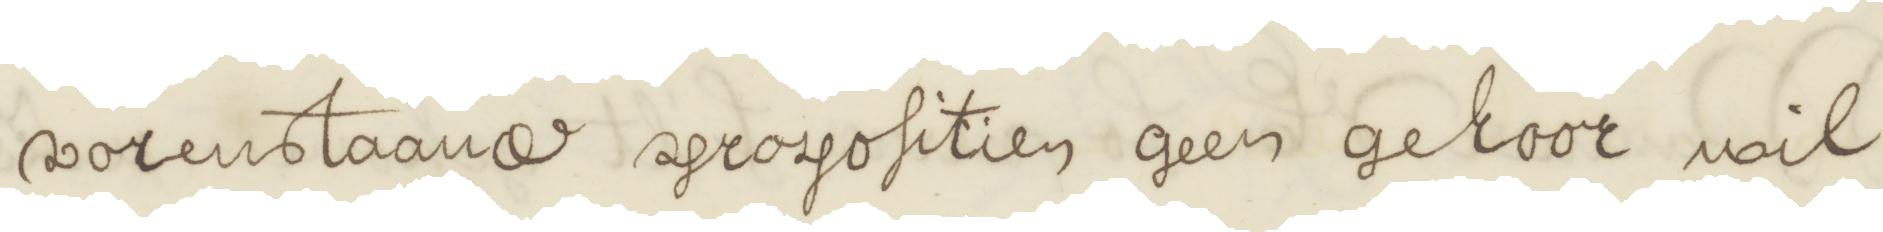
vorenstaande propositien geen gehoor wil
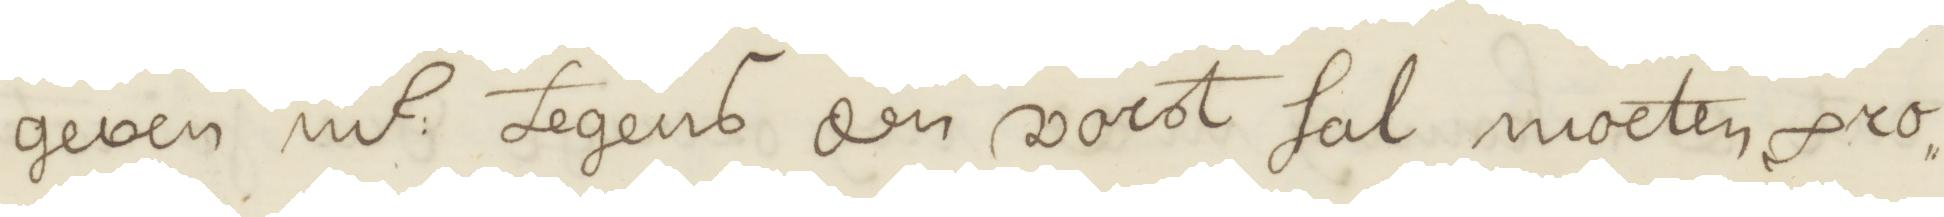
geven uE: tegens den vorst Sal moeten pro„
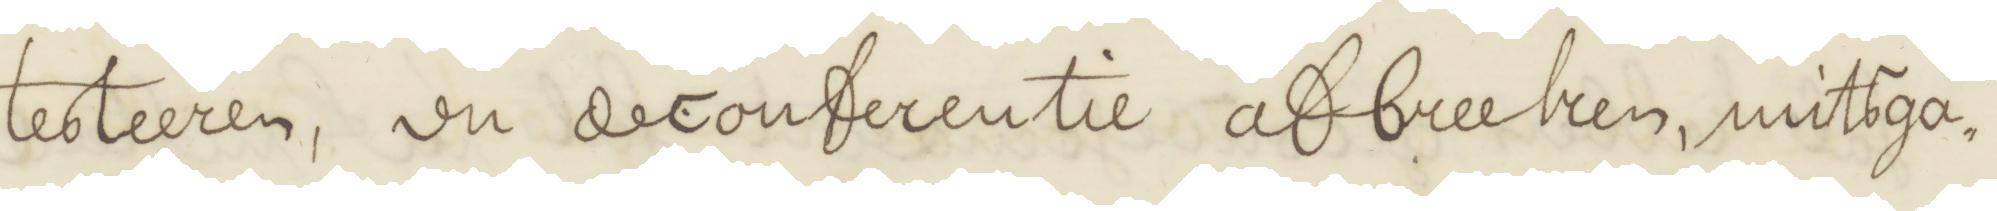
testeeren, en deconferentie afbreeken, mitsga„
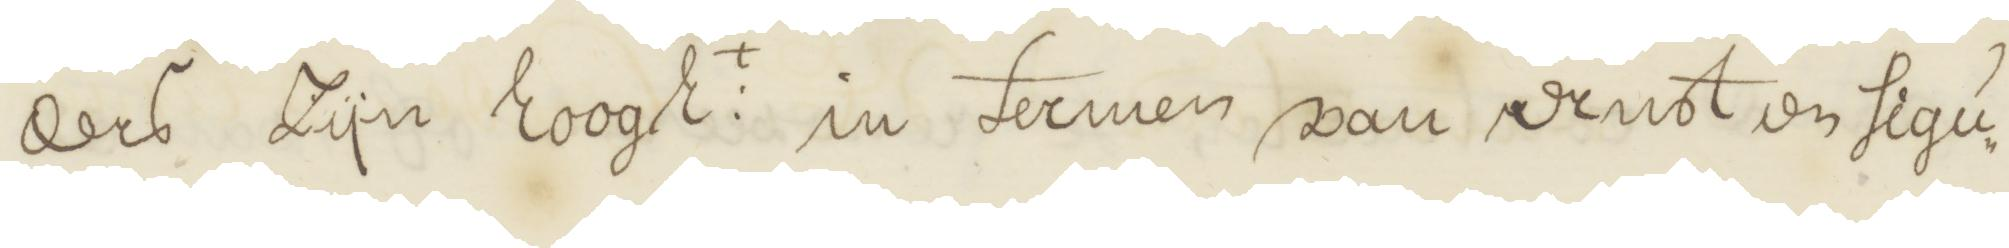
ders Zijn hoogh:t in termen van ernst en sigu„
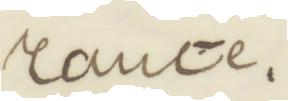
rance.
